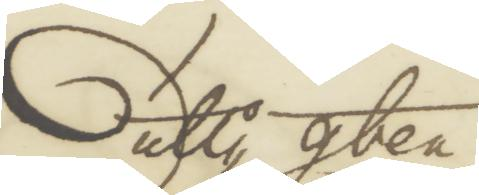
ult„o 9ber
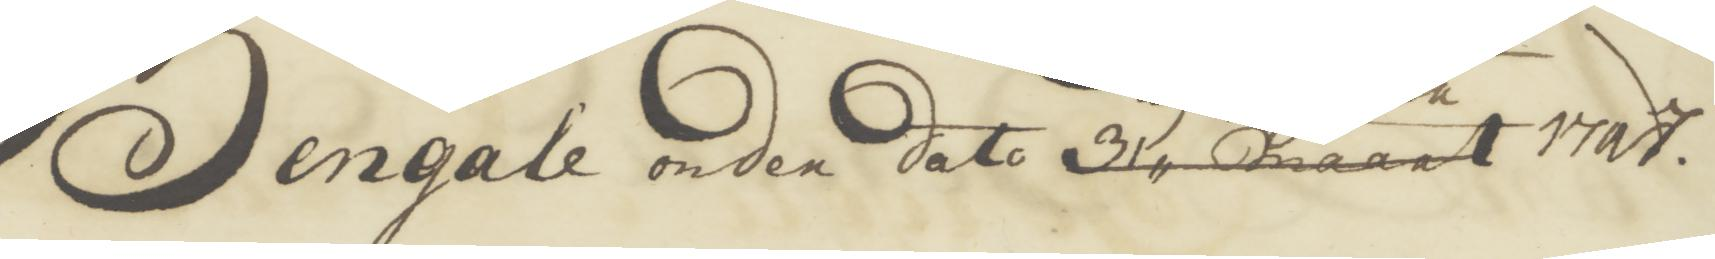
Van Bengale onder dato 31„' maart 1747.
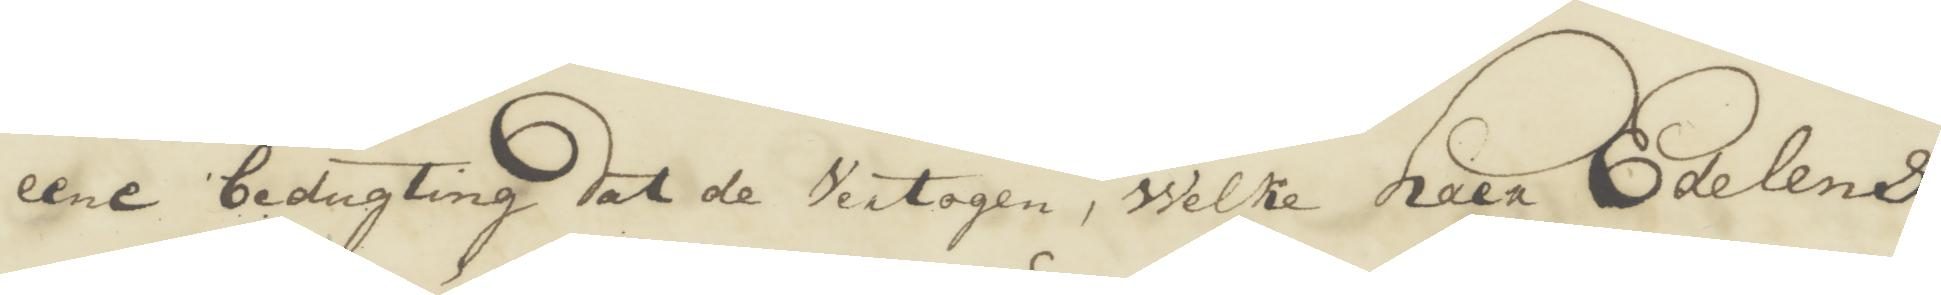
eene bedugting dat de vertogen, welke haer Edelens
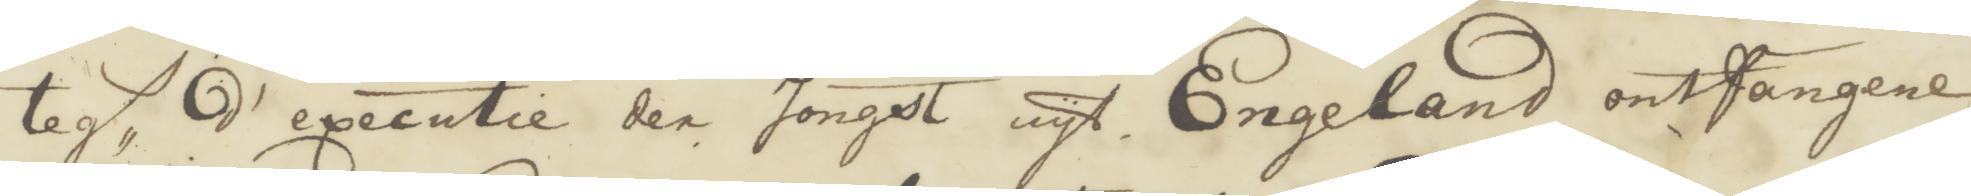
teg„s d’ executie der Jongst uijt Engeland ontfangene
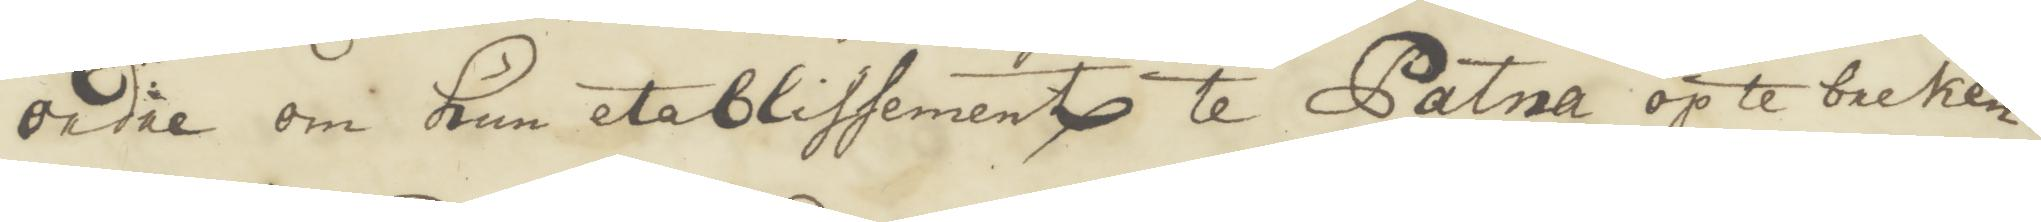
ordre om hun etablissement te Patna op te breken,
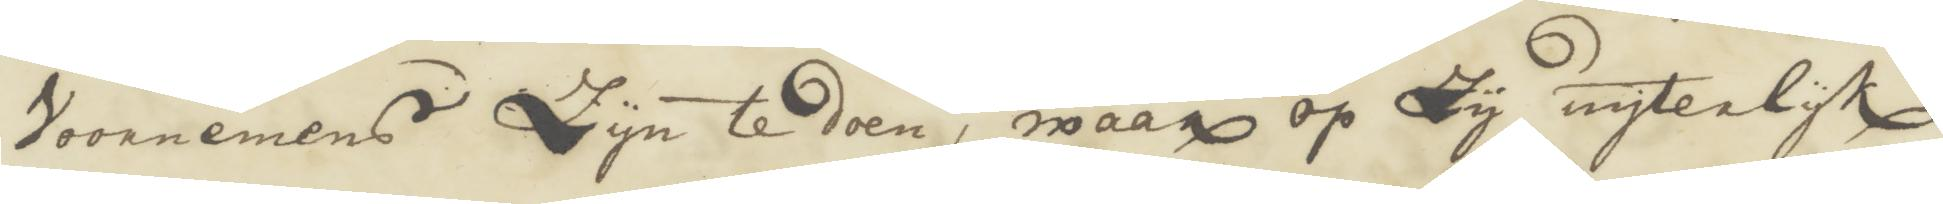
voornemens zijn te doen, waar op zij uijterlijk
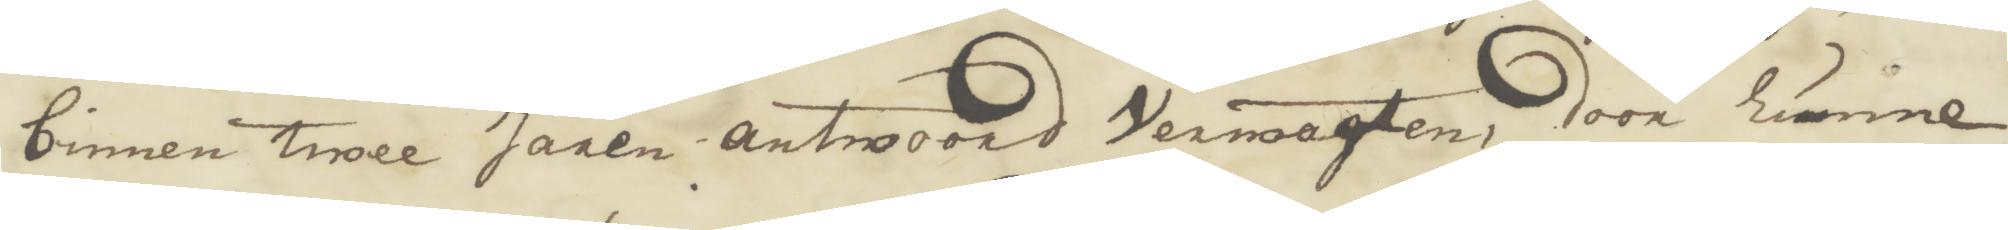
binnen twee Jaren antwoord verwagten, door hunne
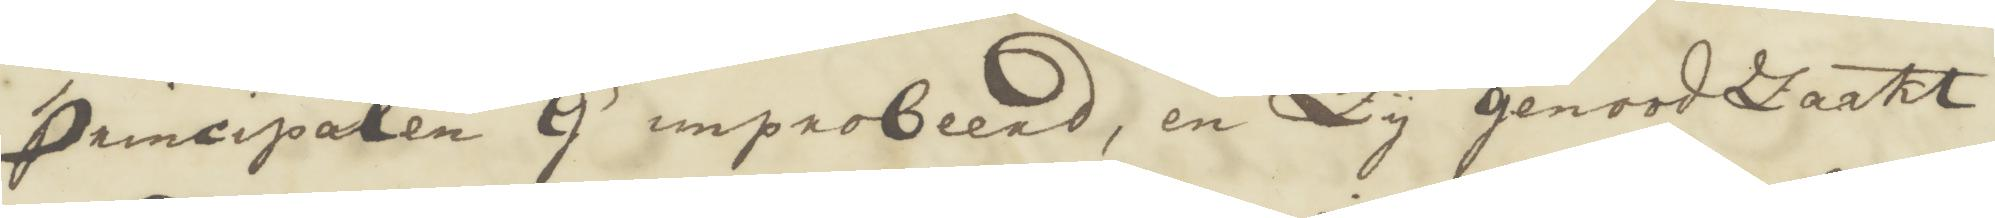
principalen g’improbeerd, en zij genoodzaakt
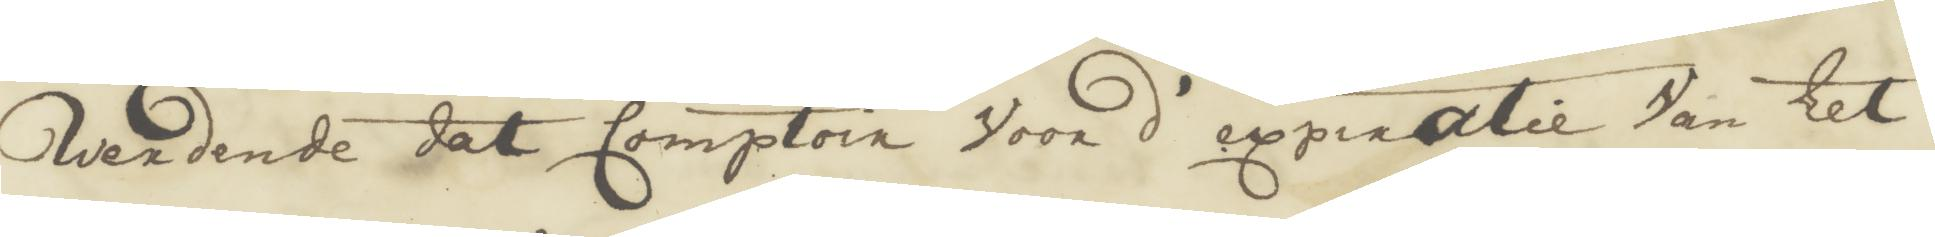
werdende dat Comptoir voor d’ expiratie van het
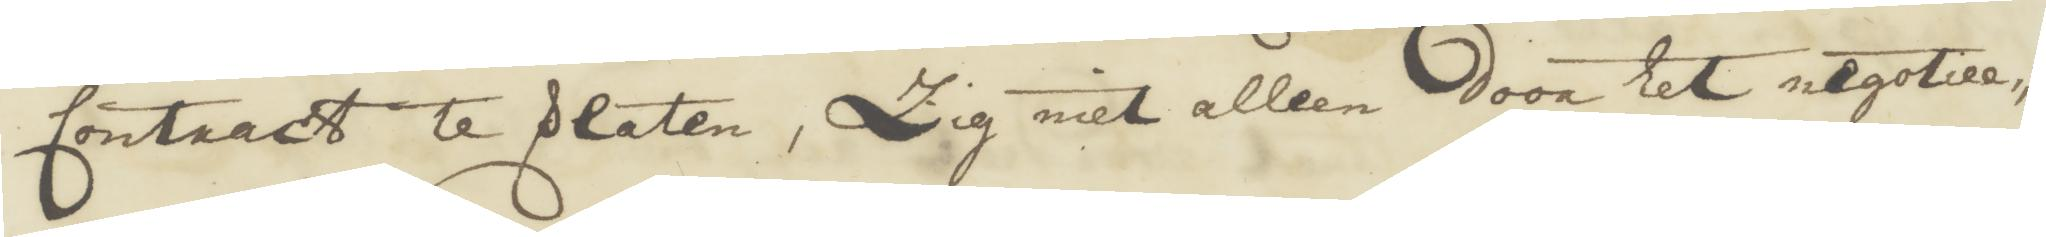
Contract te verlaten, zig niet alleen door het negotiee„
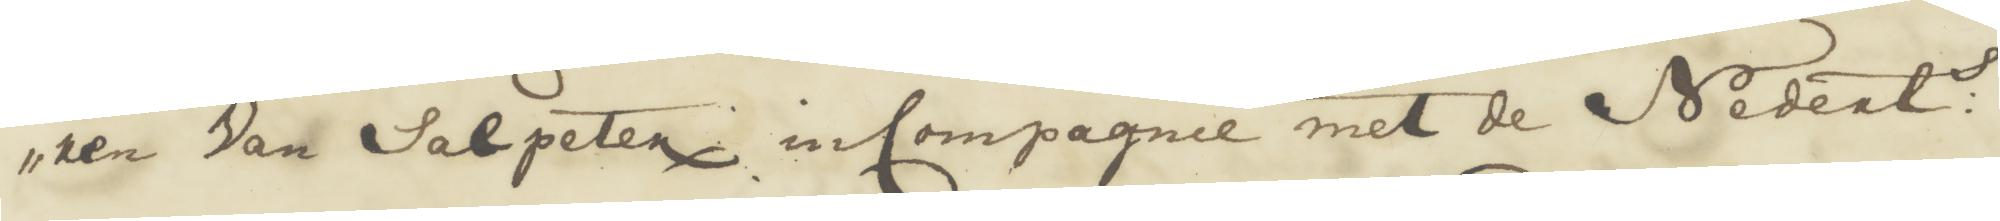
„ren van salpeter in Compagnie met de Nederl:s
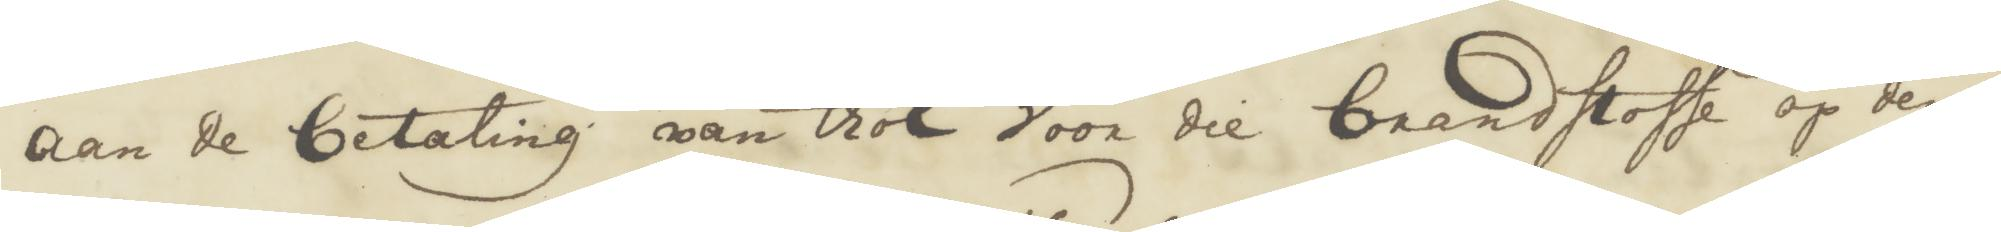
aan de betaling van thol voor die brandstoffe op den
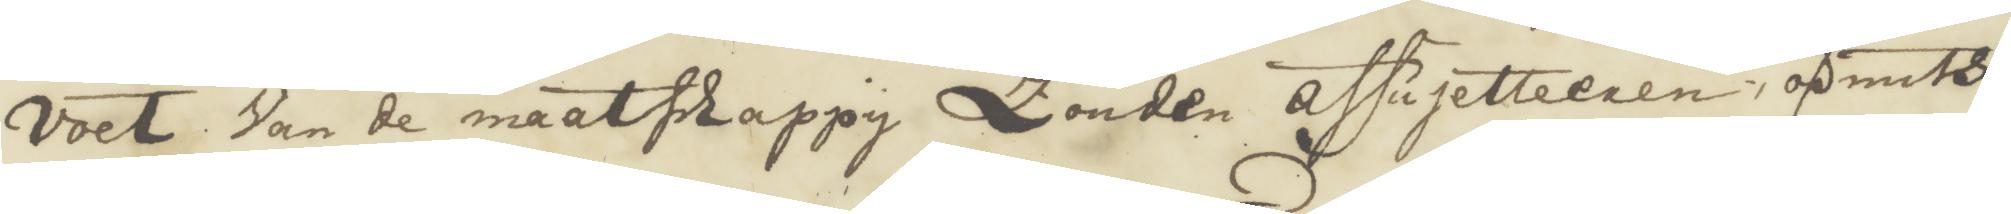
voet van de maatschappij zouden assujetteeren; overmits
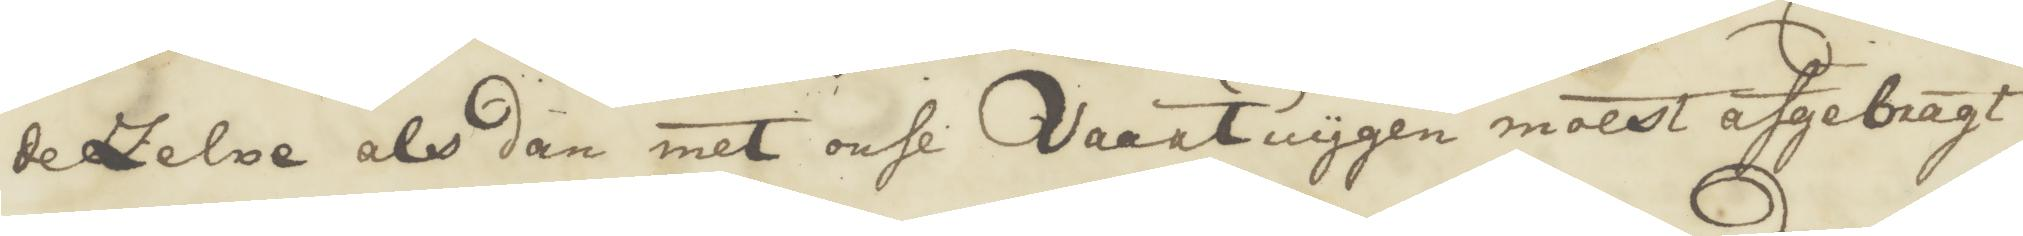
dezelve als dan met onse vaartuijgen moest afgebragt
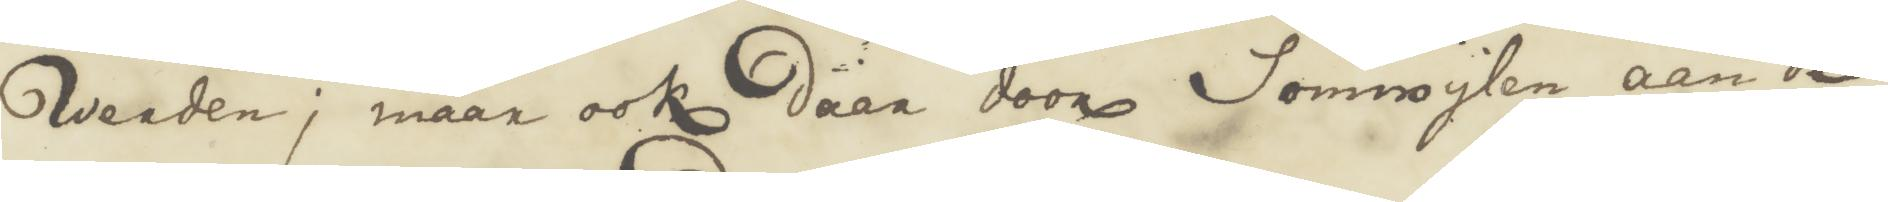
werden; maar ook daar door somwijlen aan de
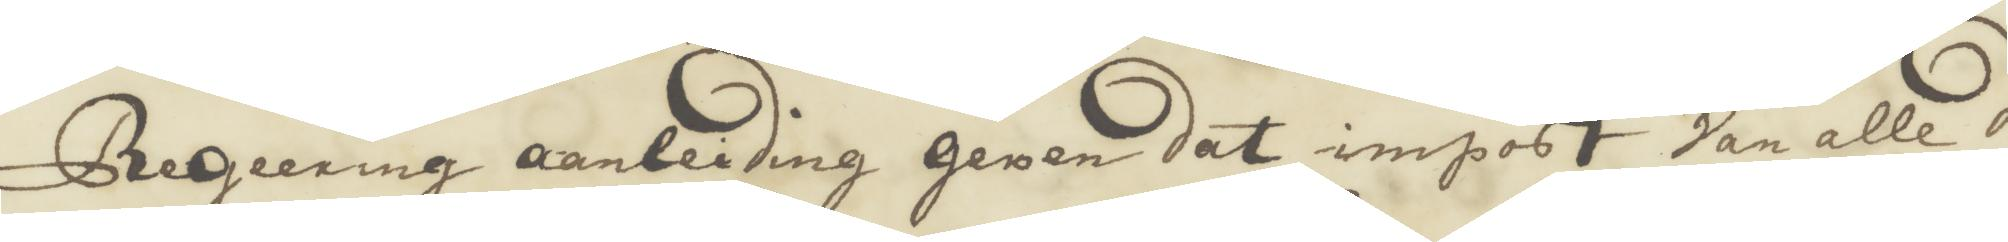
Regeering aanleiding geven dat impost van alle d'
